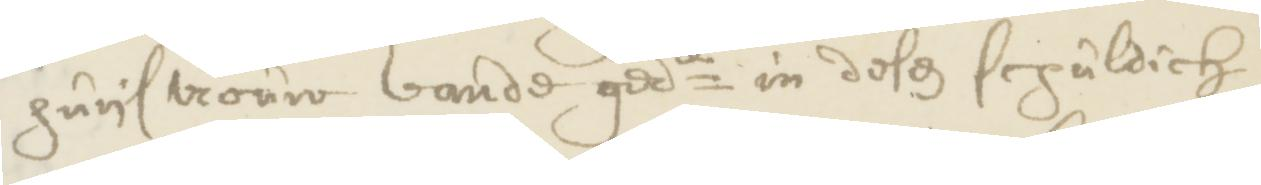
huijsvrouw vande ged=e in desen schuldich
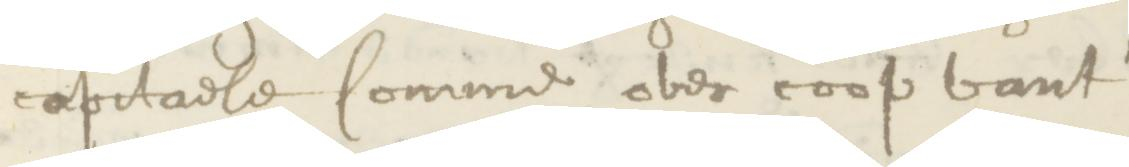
capitaele somme over coop vant
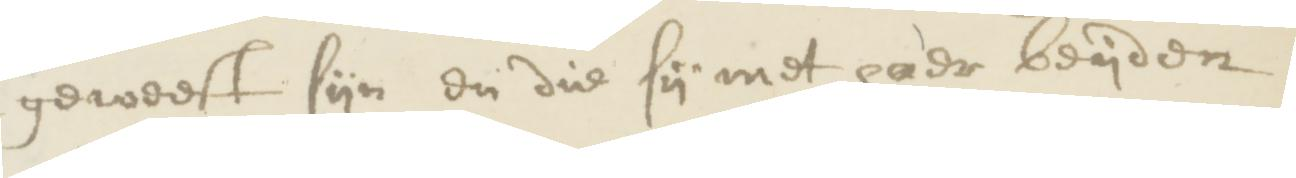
geweest sijn bij die sij met haer beijden
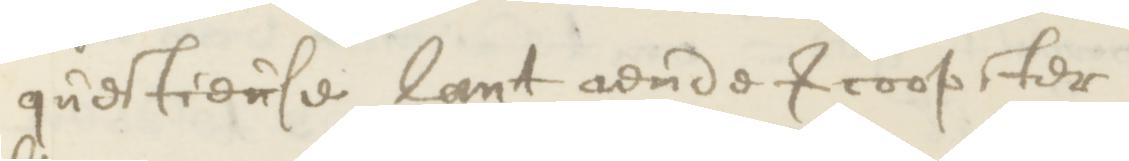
questieuse lant aen de vercoopster
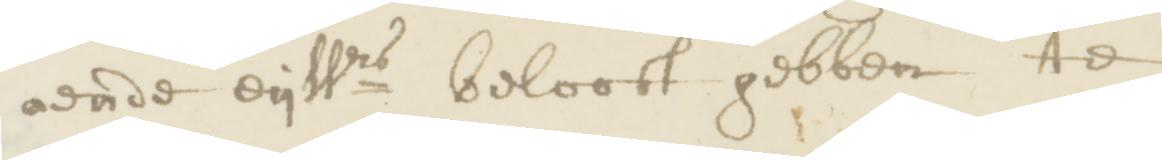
aende eijss=rs belooft hebben te
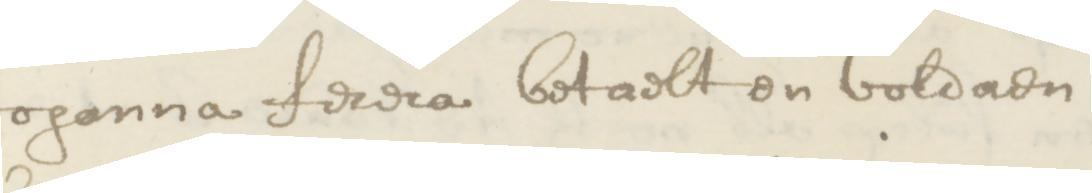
Johanna ferera betaelt en voldaen
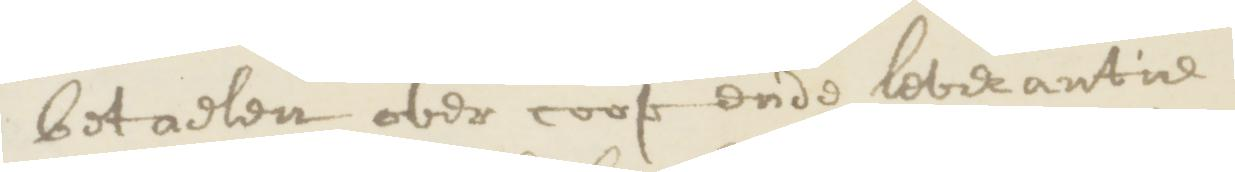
betaelen over coop ende leverantie
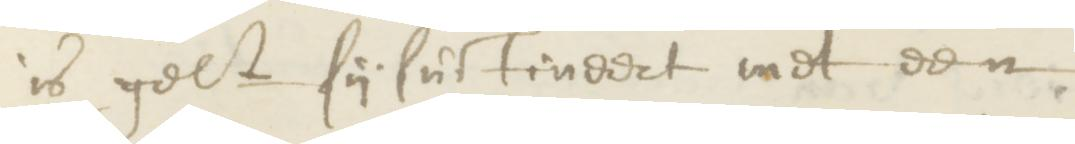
is gelijk sij sustineert met een
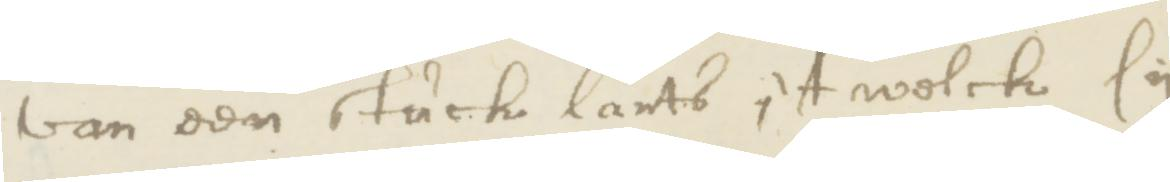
van een stuck lants, ’t welck sij
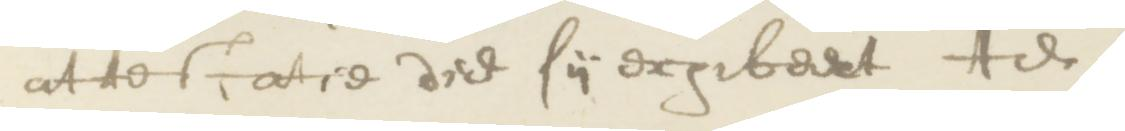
attestatie die sij exhibeert te
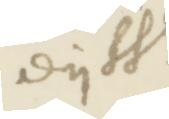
eijss=rs
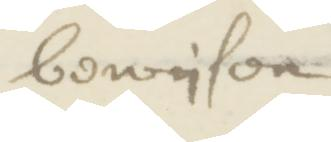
bewijsen
